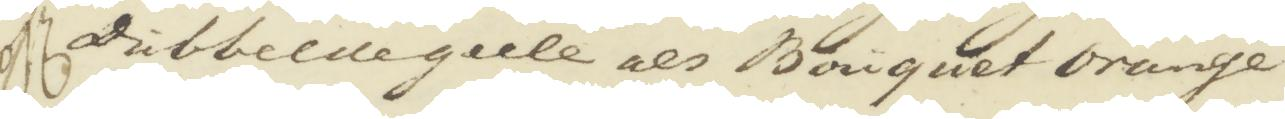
Dubbelde geele als Bouquet orange
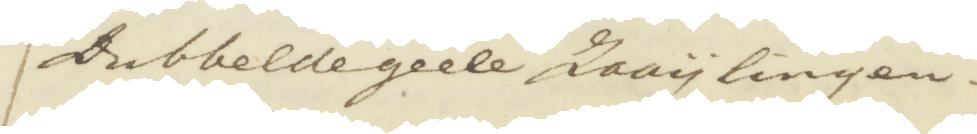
Dubbelde geele Zaaijlingen.
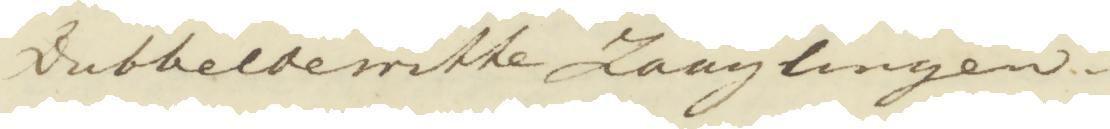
Dubbelde witte Zaaylingen
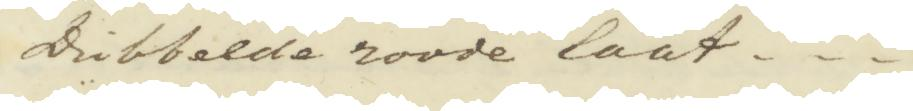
Dubbelde roode laat
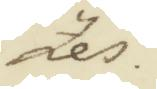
Zes.
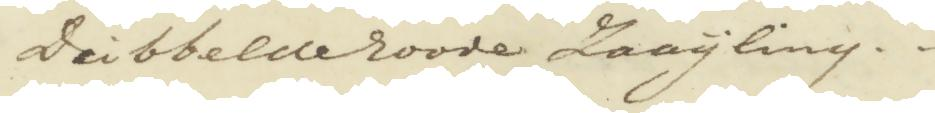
Dubbelde roode Zaaijling
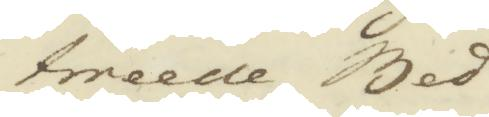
tweede Bed.
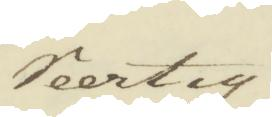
Veertig
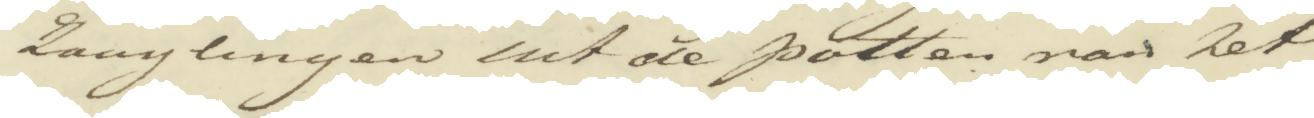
Zaaylingen uit de potten van het
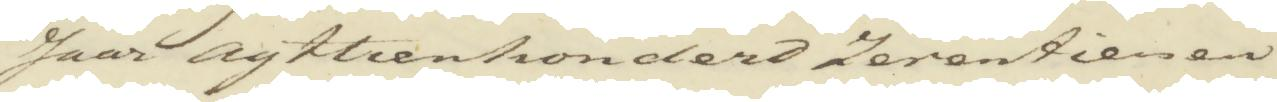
Jaar agttienhonderd Zeventien en
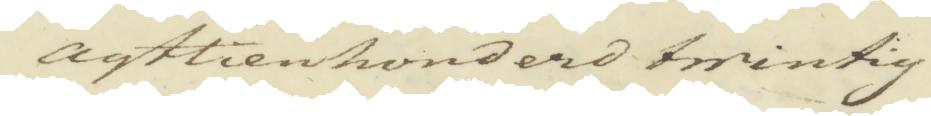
agttienhonderd twintig
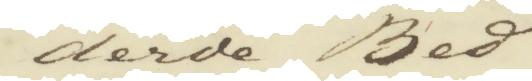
derde Bed
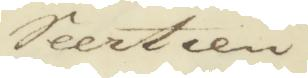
Veertien
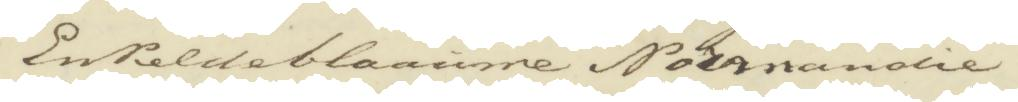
Enkelde blaauwe Normandie
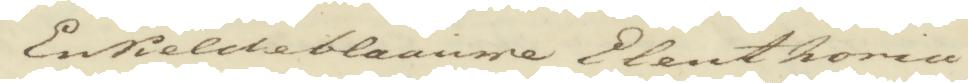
Enkelde blaauwe Elenthoria
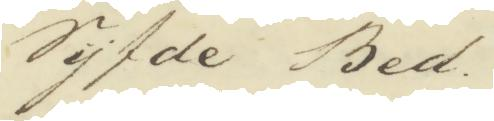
Vijfde Bed.
